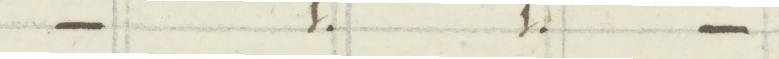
— 1. 1. —
